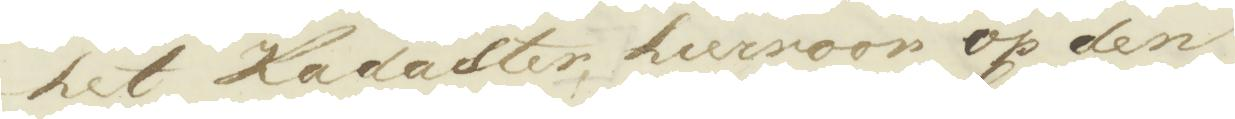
het Kadaster, hiervoor op den
